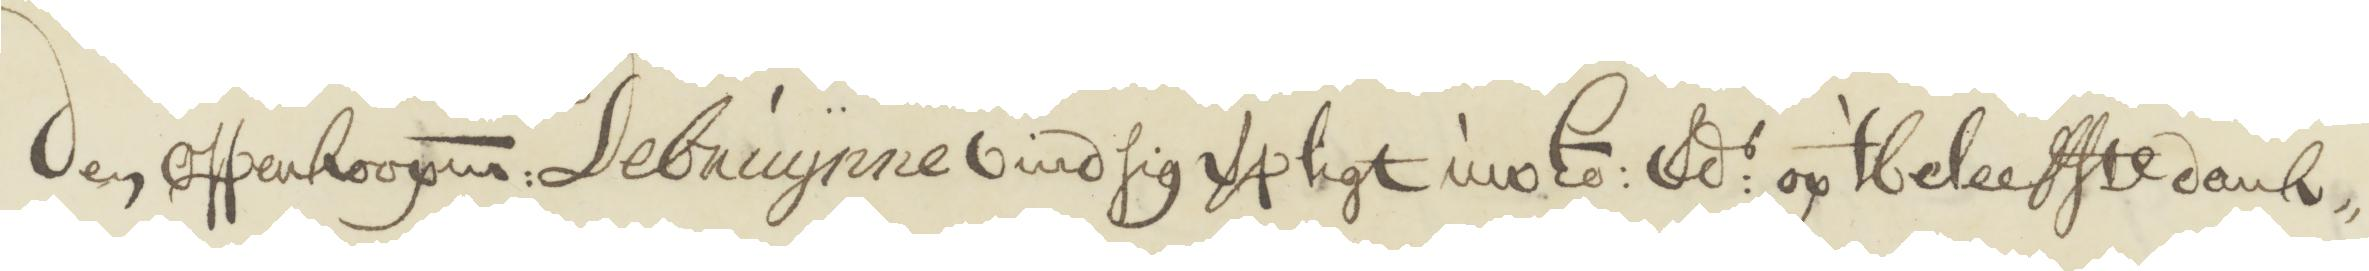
den opperkoopm: De bruijnne vind sig verpligt uw ho: Ed:s op 'tbeleeffte dank„
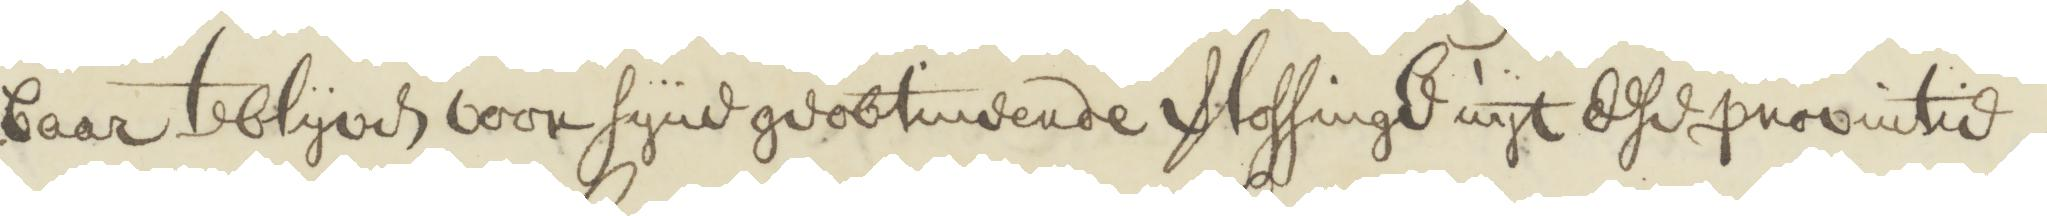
baar te blijven voor sijne geobtineerde verlossingh uijt dese provintie
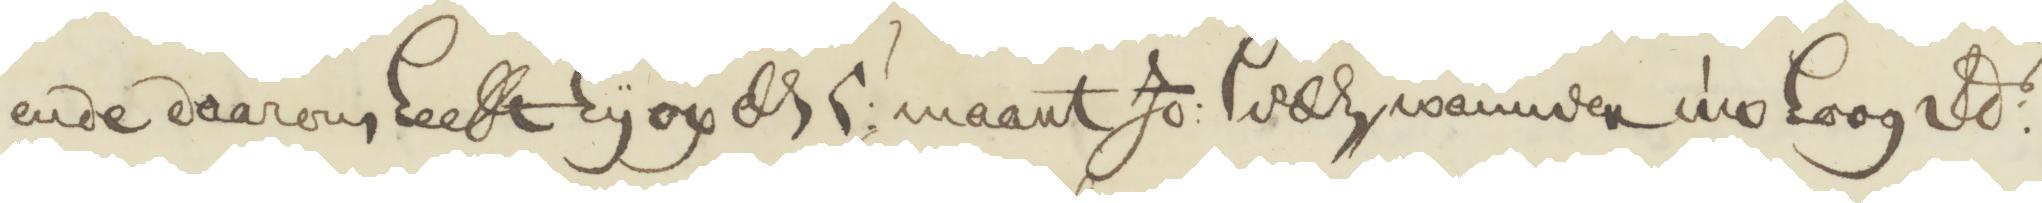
ende daarom, heeft hij op den 5:' maart Jo: leden, wanneer uw hoog Ed:s
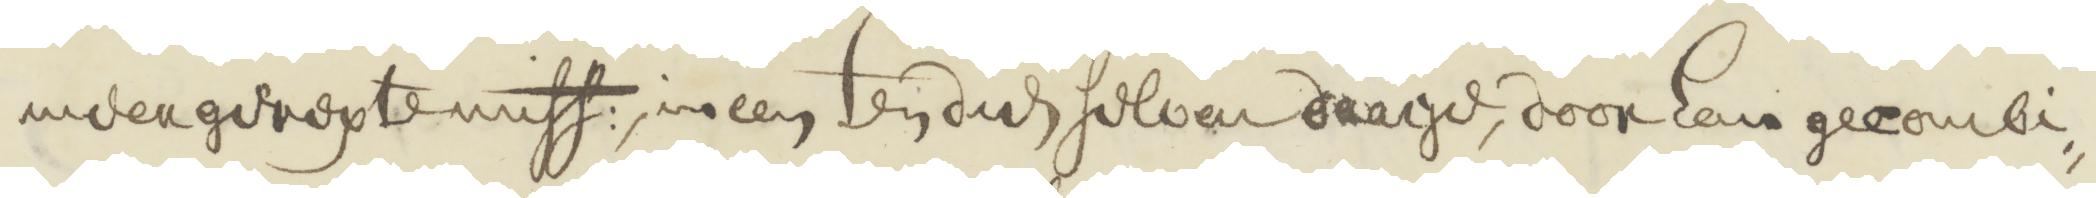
meer gerepte miss:, in een ten dien selven daage, door hem gecombi„
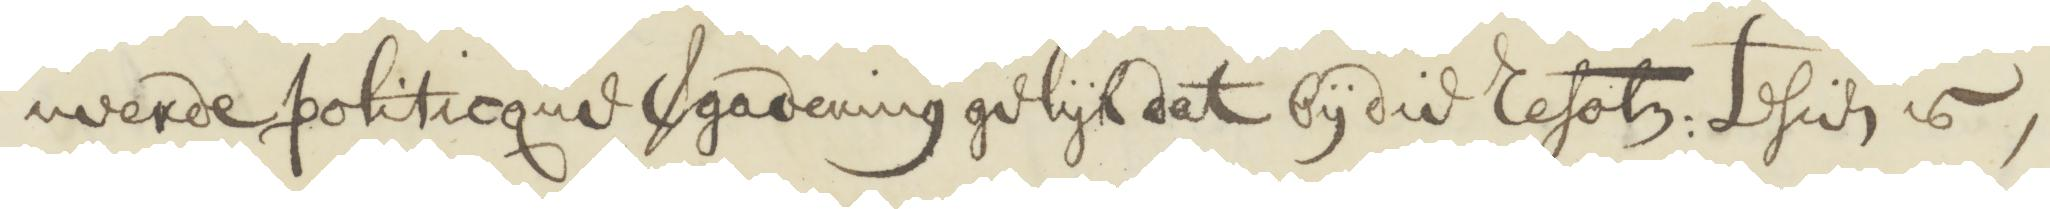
neerde politicque vergadering gelijk dat bij die resolz: tesien is,
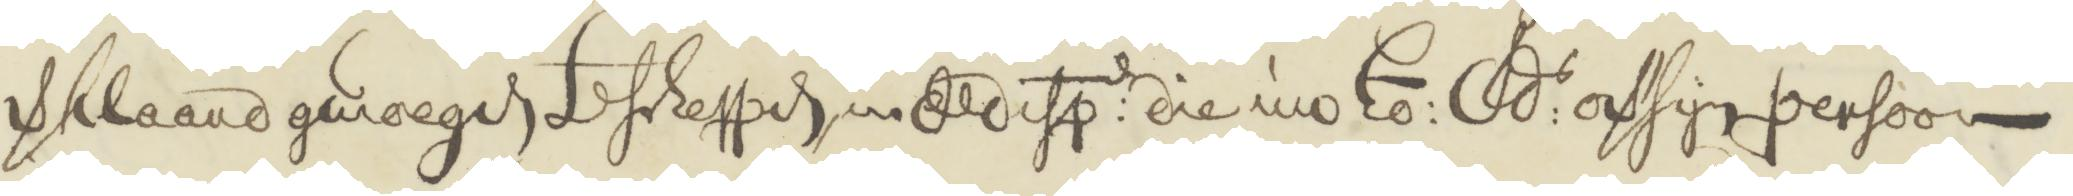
verklaard genoegen te scheppen, in de disp:e die uw Ho: Ed:s over sijn persoon
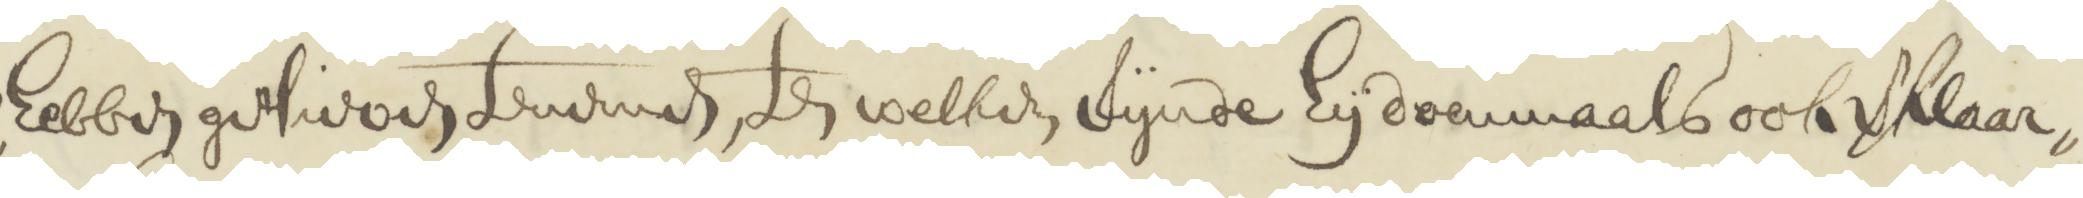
hebben gelieven tenemen, ten welken Eijnde hij doenmaals ook verklaar„
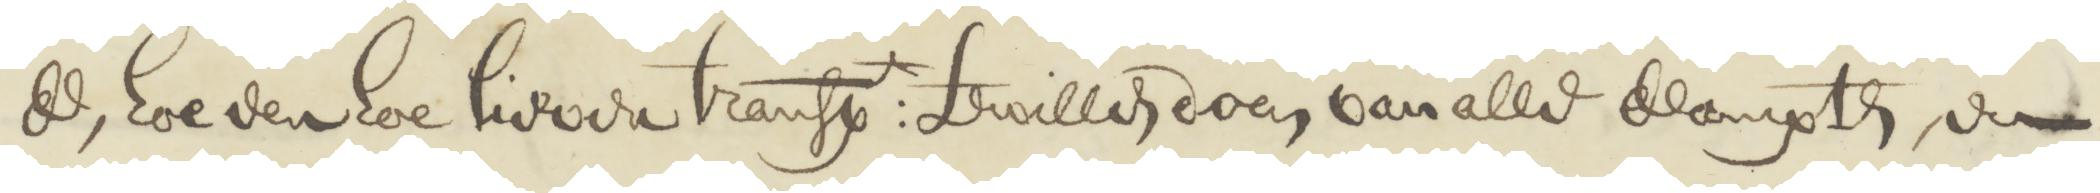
de, hoe eer hoe liever transp:t te willen doen van alle de ampten, en
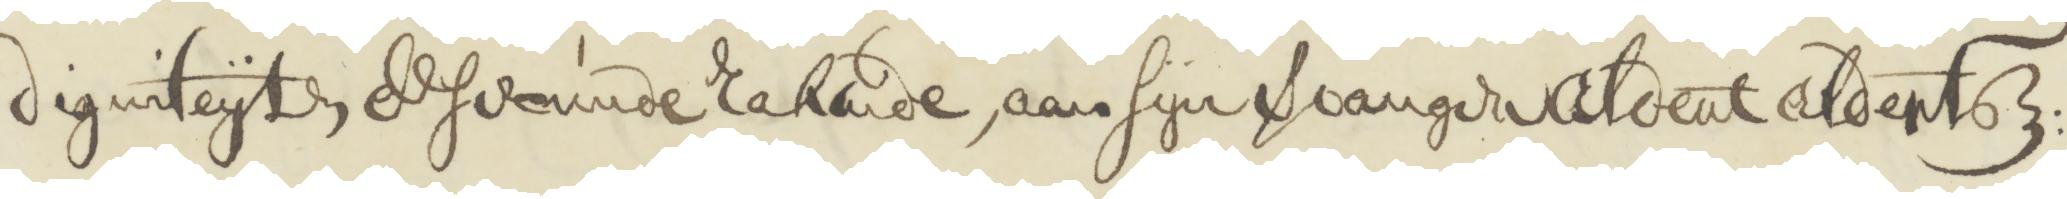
digniteijten de secunde rakende, aan sijn vervangen aldert aldertsz:
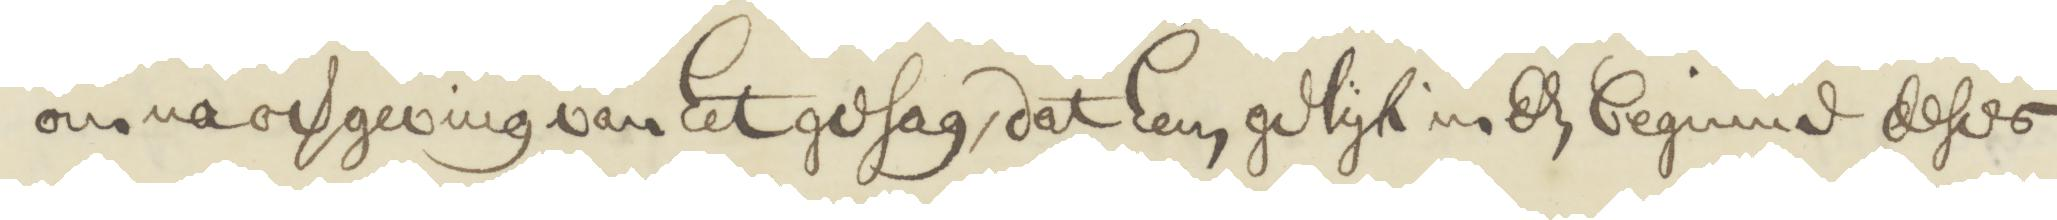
om na overgeving van het gesag, dat hem gelijk in den beginne deses
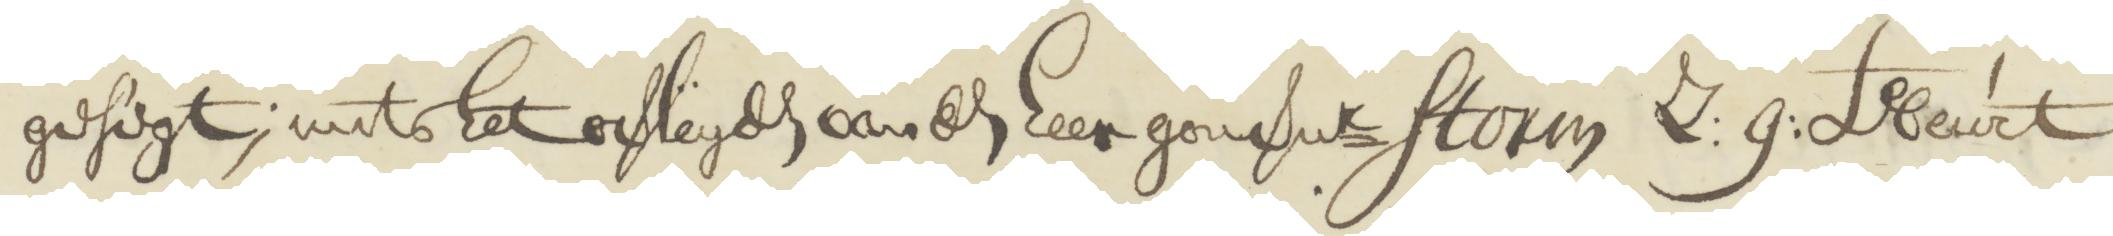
gesegt; mits het overleijden van den heer gouvern=r storm z: g: tebeurt
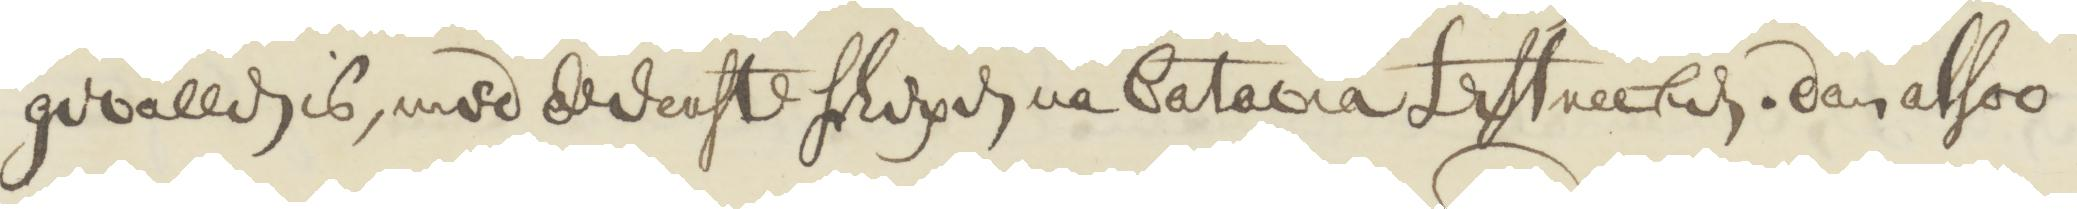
gevallen is, med de Eerste schepen na batavia te vertrecken, dan alsoo
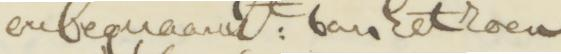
en bequaamh:t van het roer
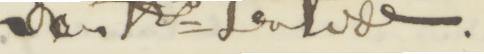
van 'th=s terlede.
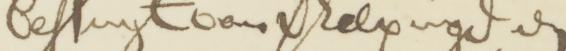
besluijt van verhelpinge en
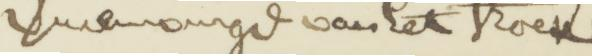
vernieuwinge van het troer
